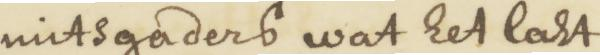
mitsgaders wat het last
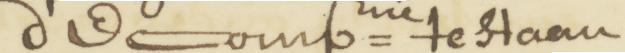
d’ E comp=nie te staan
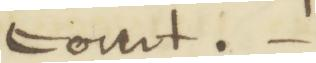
comt. —
